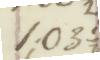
1.03½
